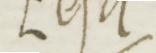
594
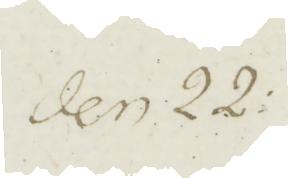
den 22:
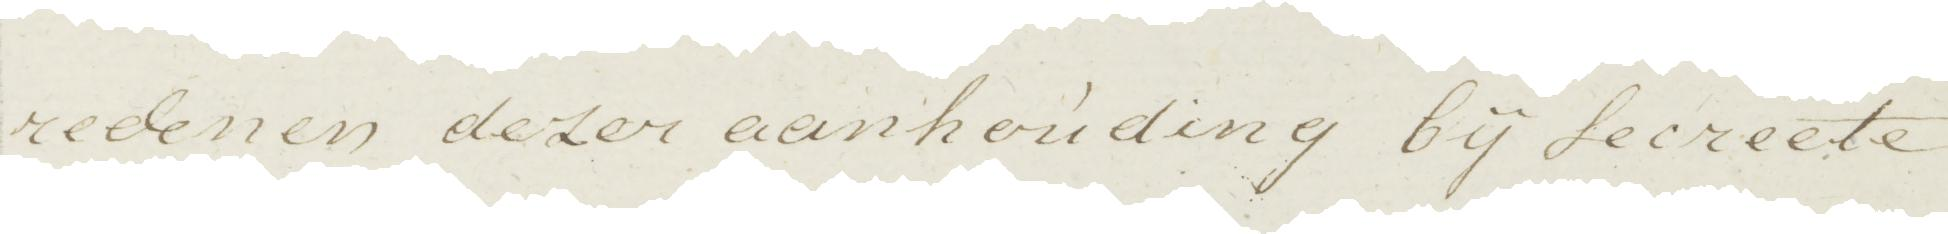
redenen dezer aanhouding bij secreete
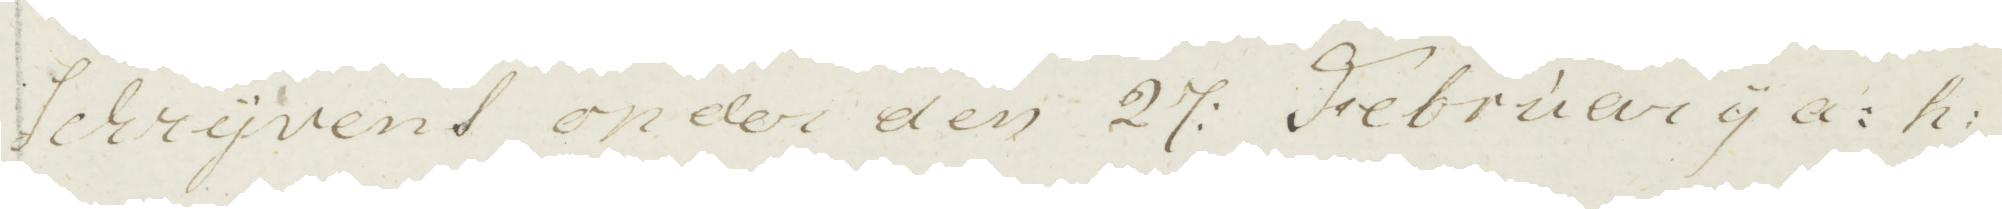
schrijvens onder den 27. Februarij a: h:
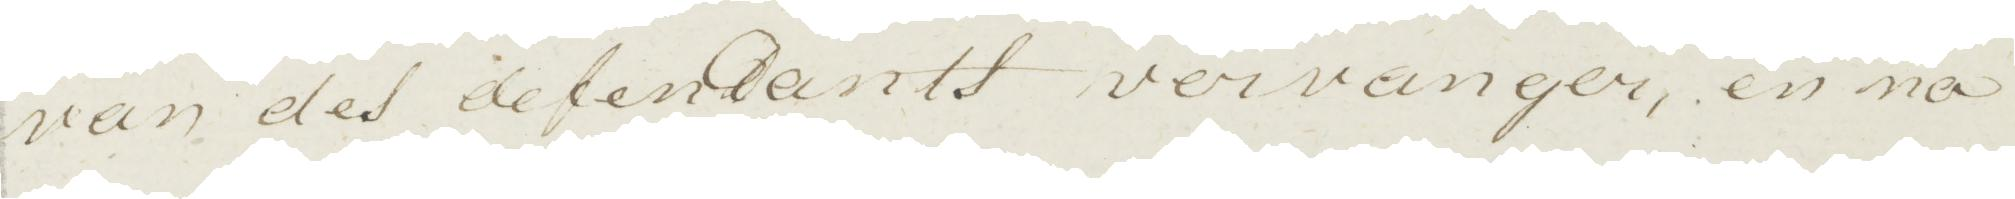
van des defendants vervanger, en na
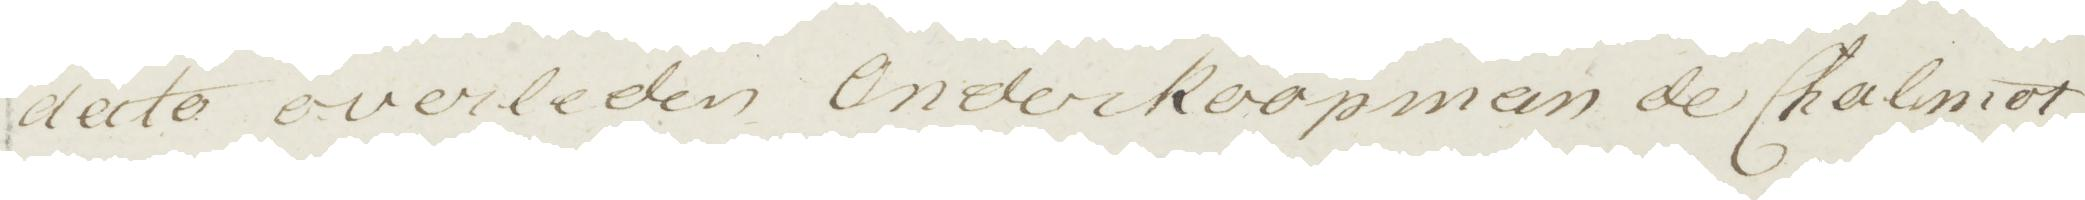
dato overleden onderkoopman de Chalmot,
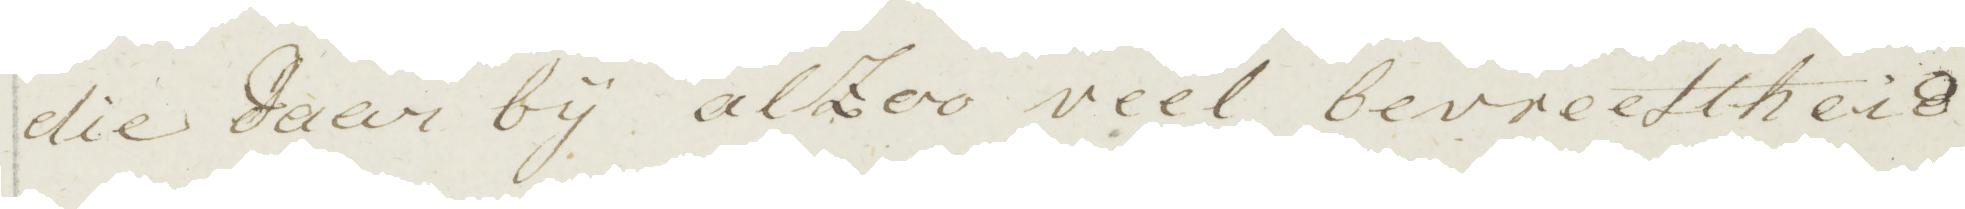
die daar bij alzoo veel bevreestheid
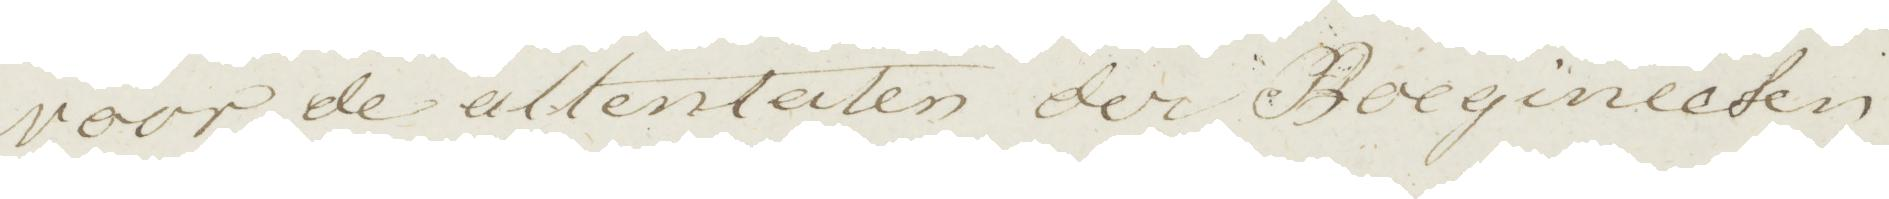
voor de attentaten der Boegineesen
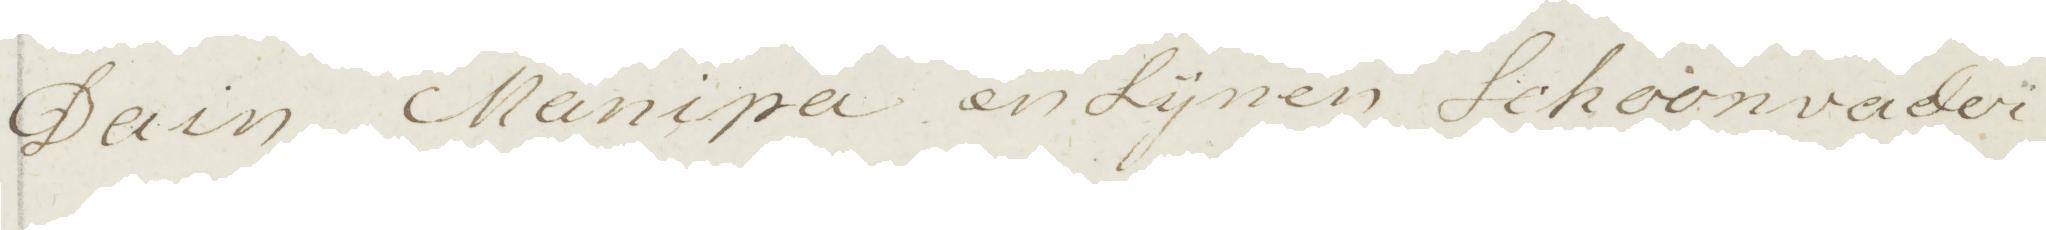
Dain Manipa en sijnen Schoonvader
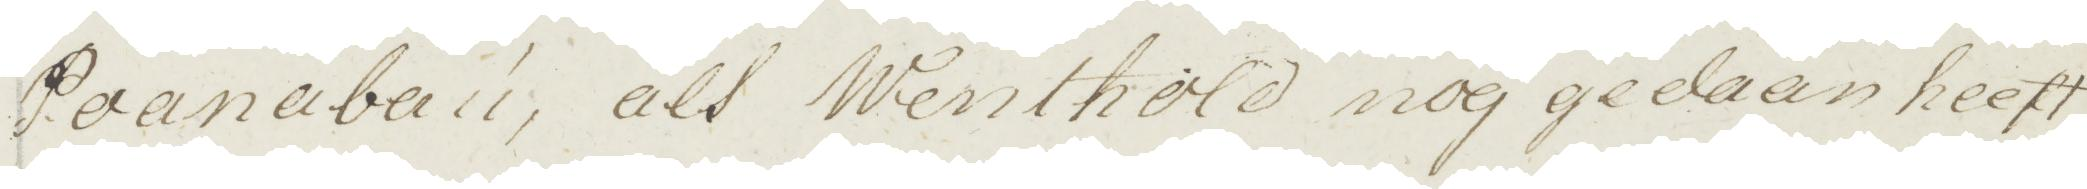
Poanabau, als Wenthold nog gedaan heeft
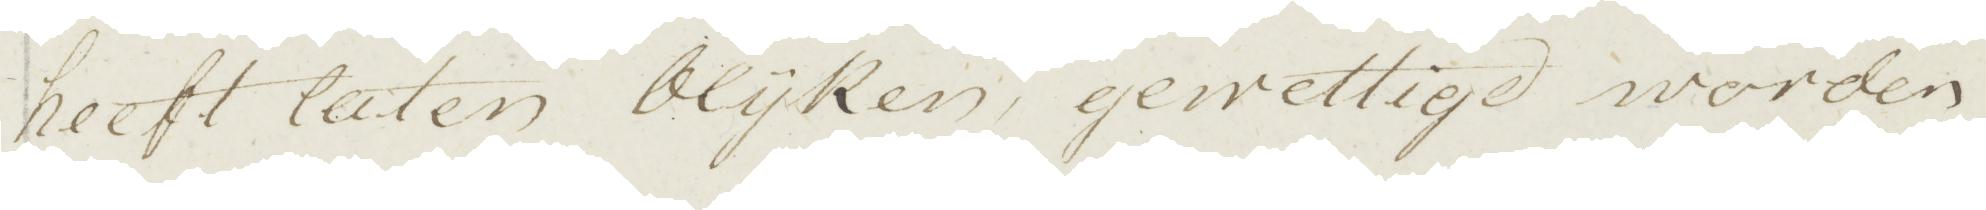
heeft laten blijken, gewettigd worden
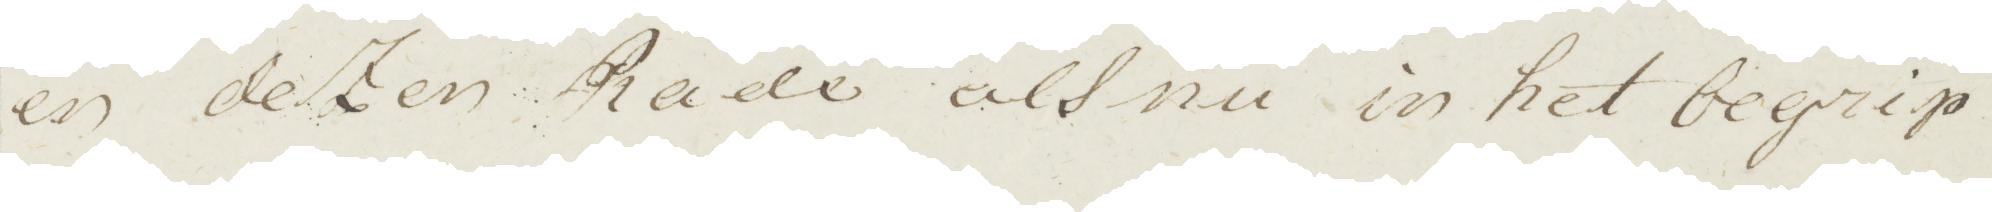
en dezen Rade als nu in het begrip
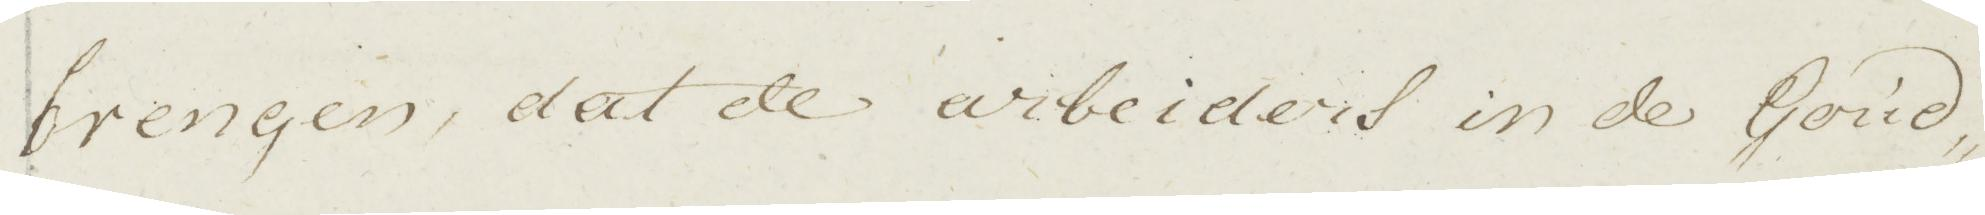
brengen, dat de arbeiders in de Goud„
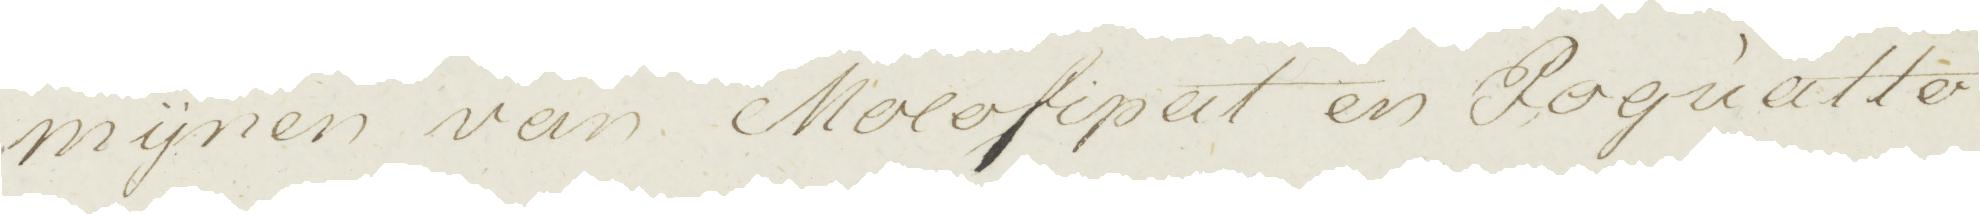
mijnen van Molosipat en Poguatto
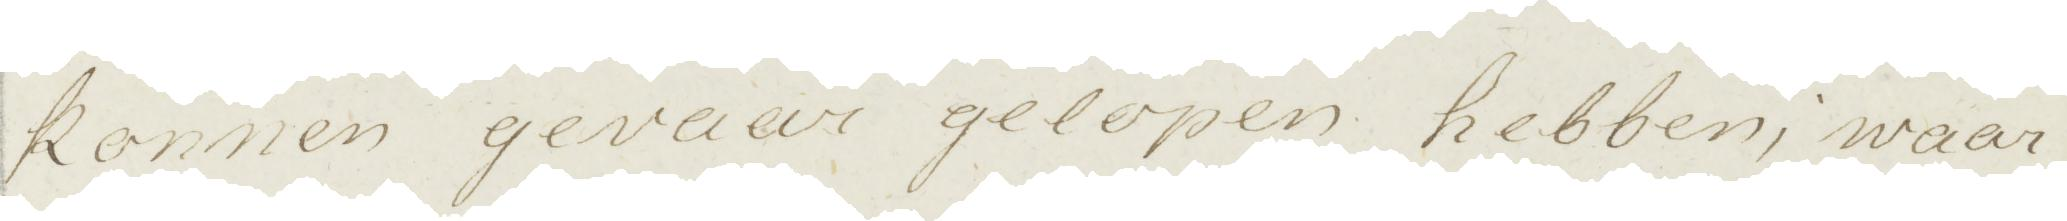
konnen gevaar gelopen hebben; waar
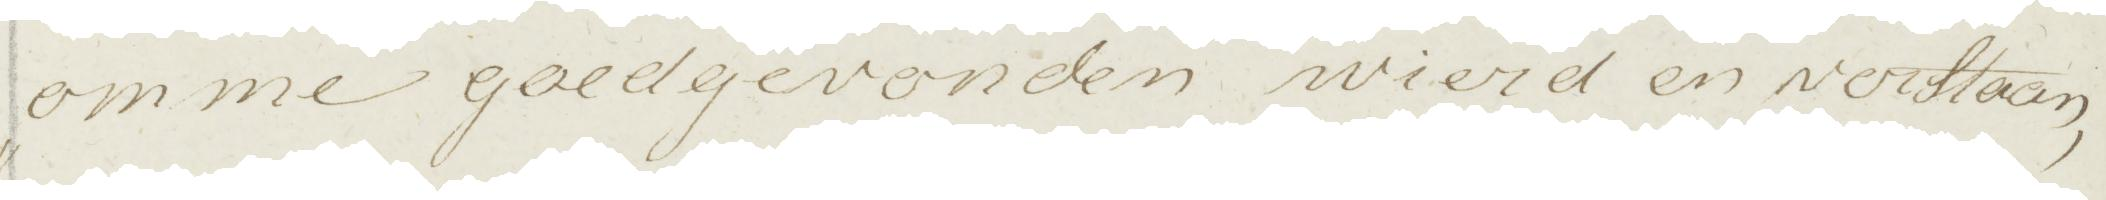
„omme goedgevonden wierd en verstaan,
